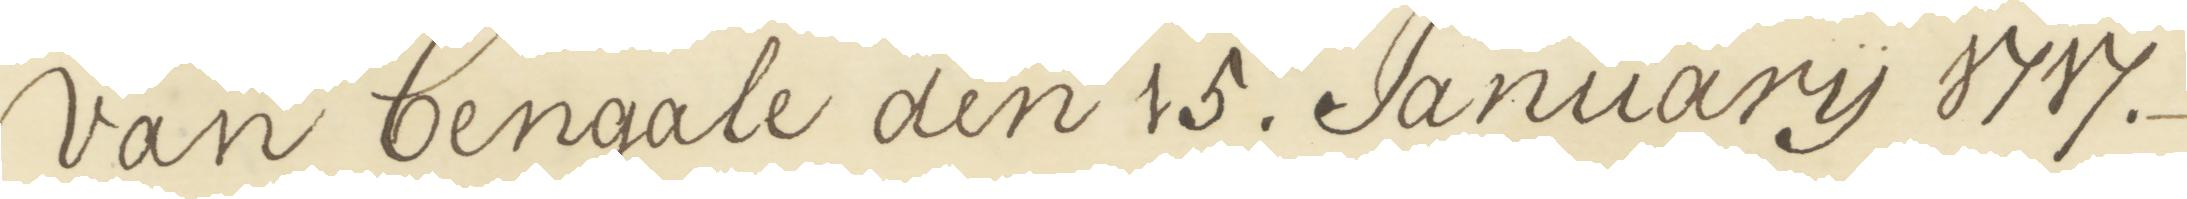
van bengale den 15.' Januarij 1717.
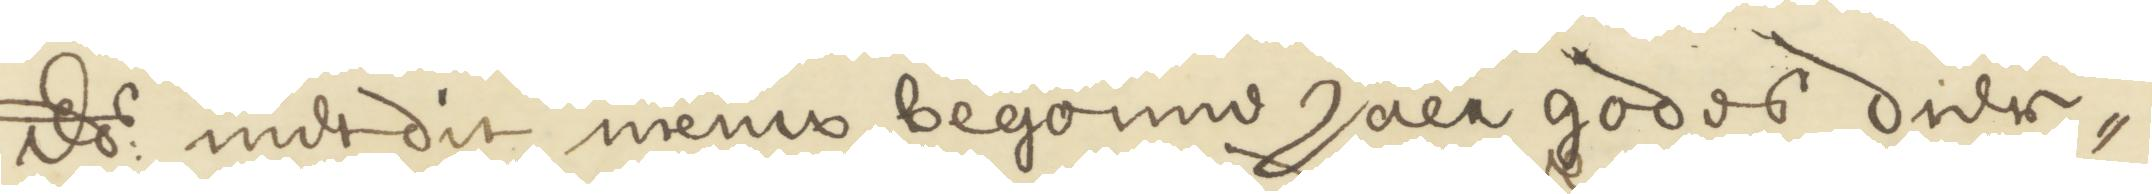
Ed:s met dit nieuw begonne Jaer godes dier„
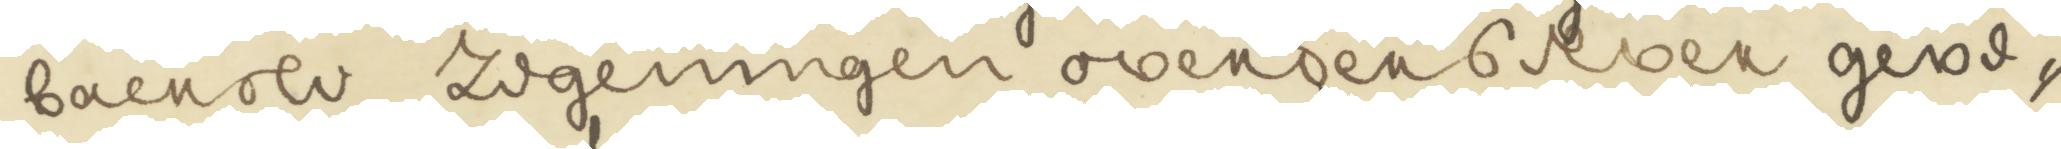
baerste Zegeningen over derselver geve„
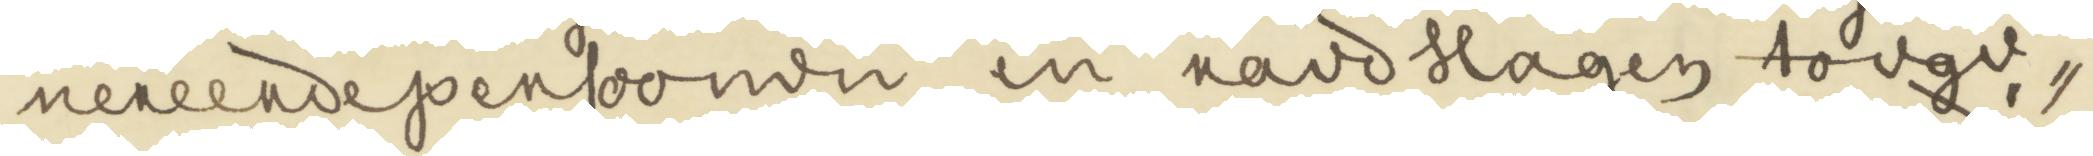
nereerde persoonen en raedslagen toege„
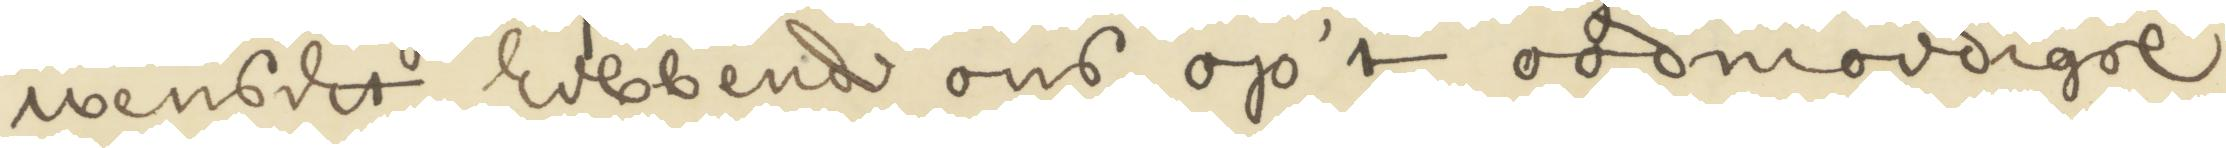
wenscht hebbende ons op ’t oodmoedigst
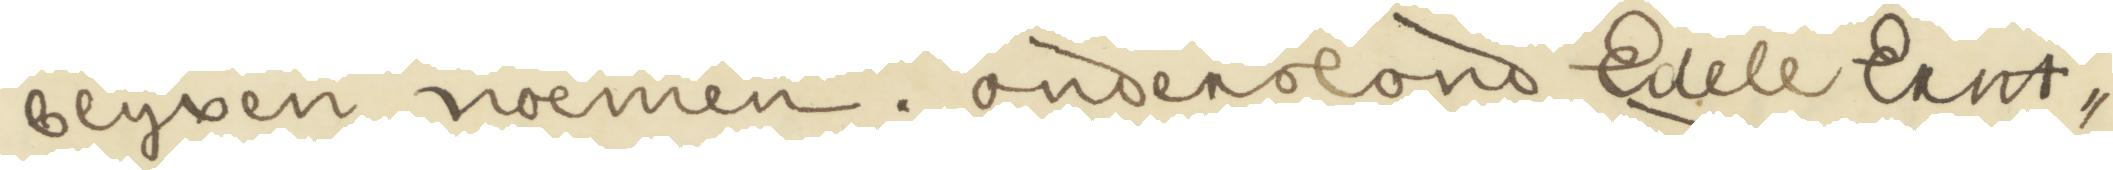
blijven noemen. onderstond Edele Ernt„
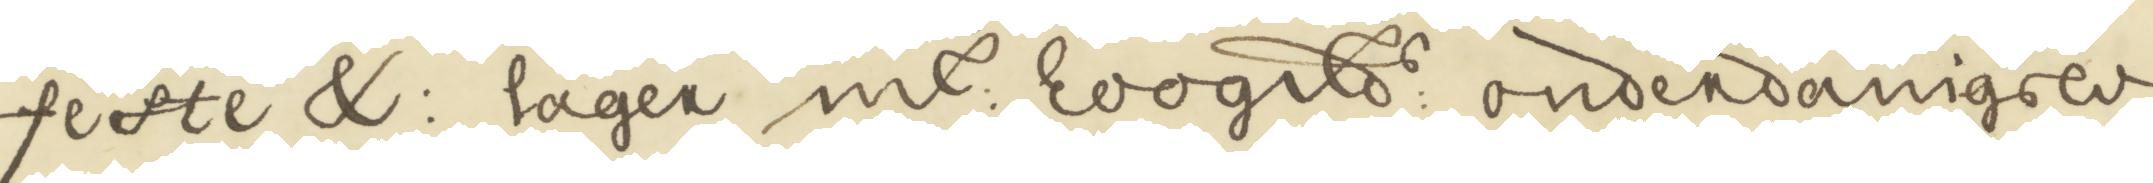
feste &: lager uE: hoogEd:s onderdanigste
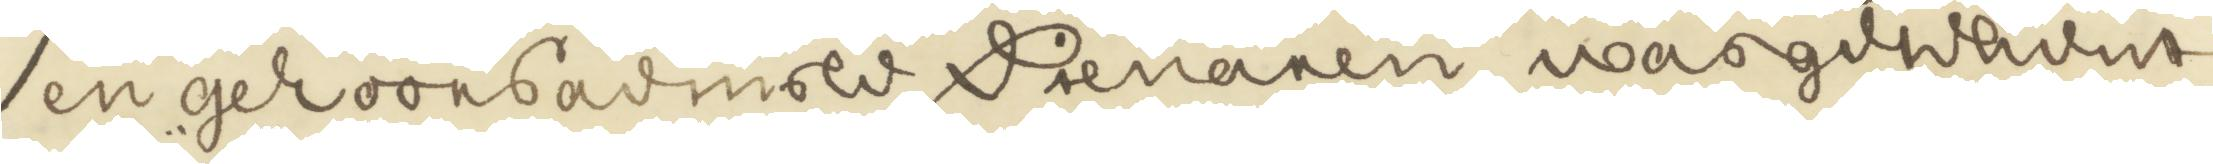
en gehoorsaemste Dienaren was getekent
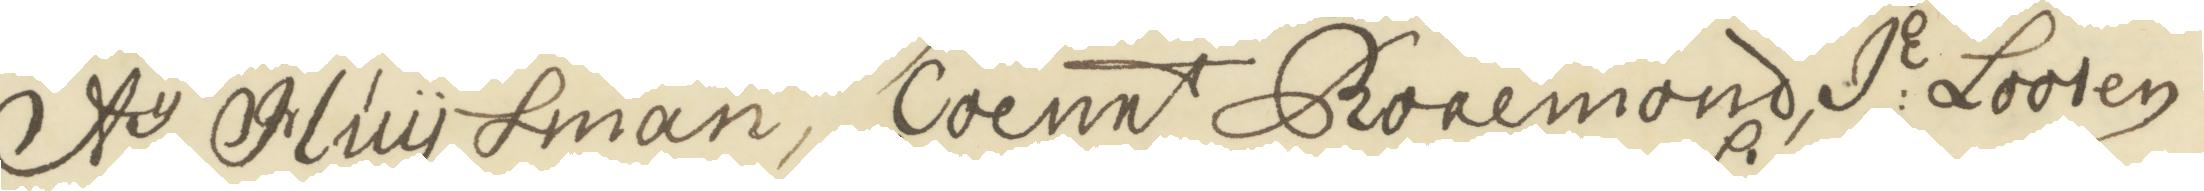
A=ij Huijsman, Coenr:t Roremond, J:h Looten
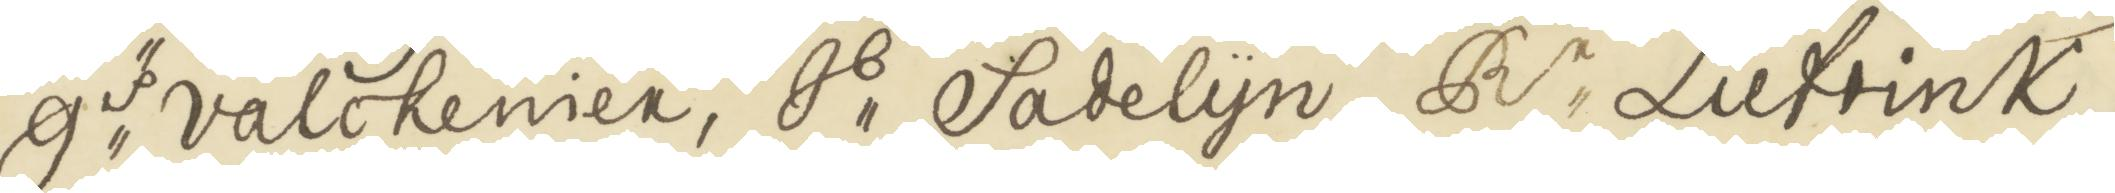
g„s valckenier, J„b Sadelijn, R„r Lieftink,
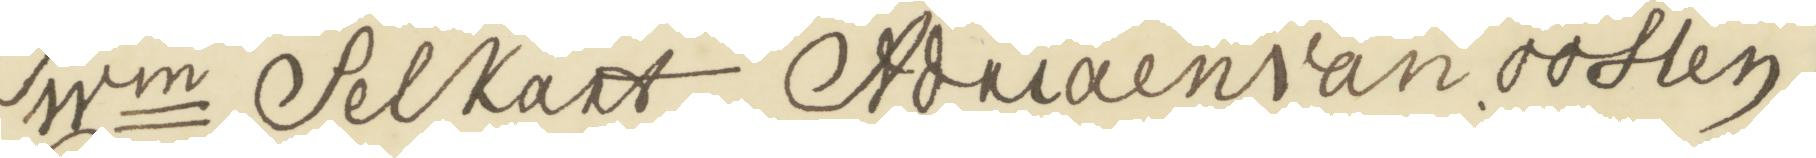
W=m Selkart, Adriaen van oosten,
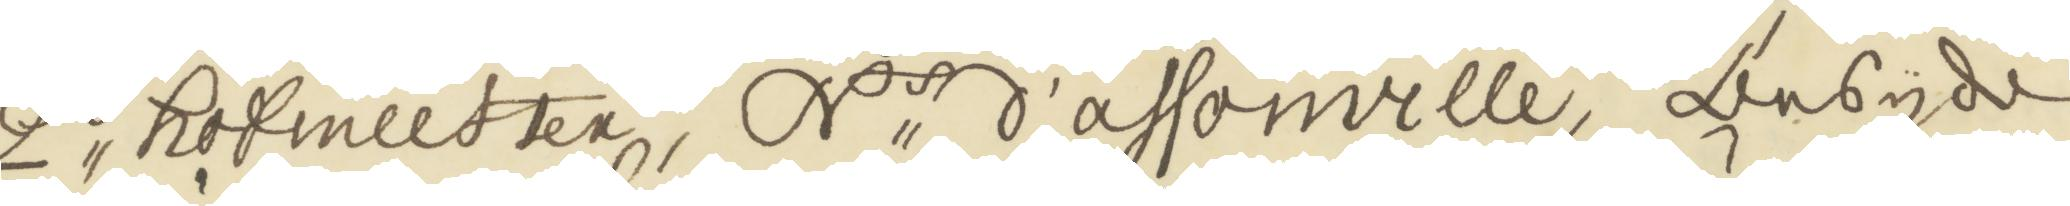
P„r hofmeester, N„s d’assonville, tersijde
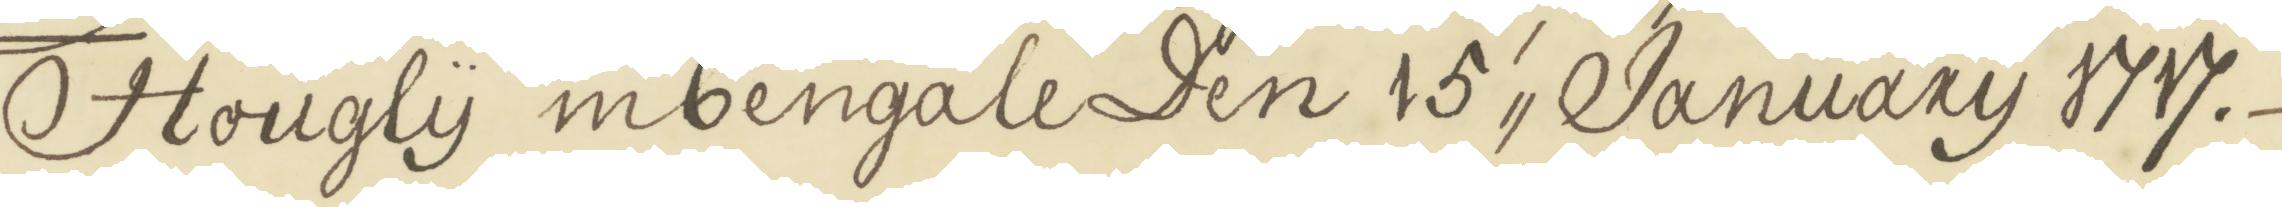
Houglij in bengale Den 15„' Januarij 1717.
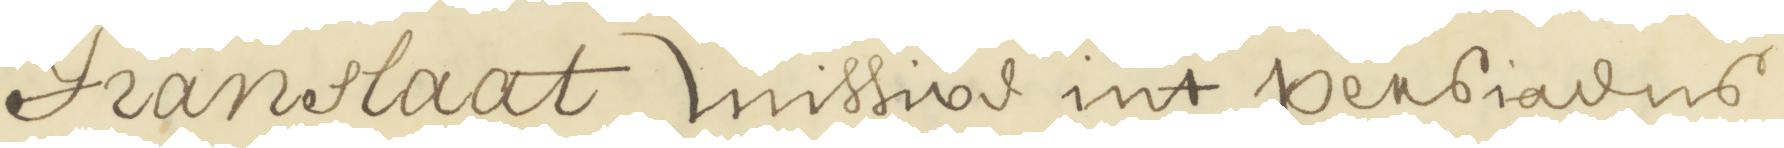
Translaat missive in 't persiaens
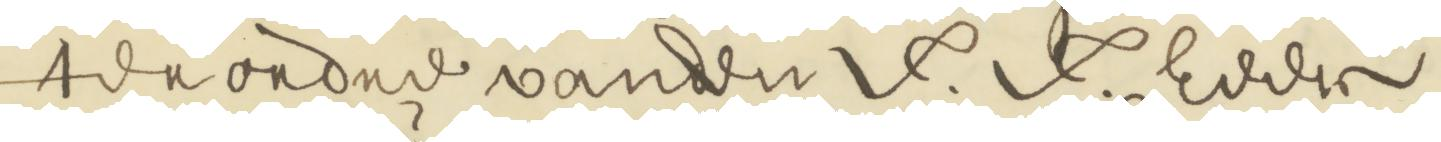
ter ordre van den E. E. heer
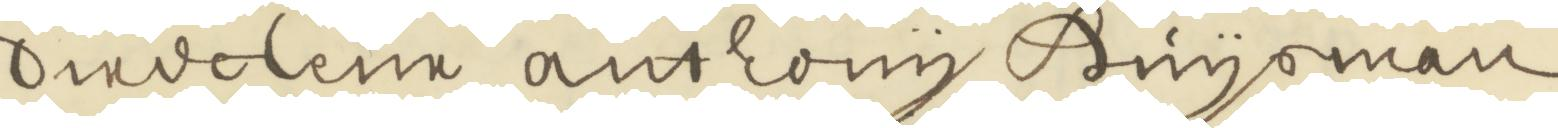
directeur anthonij Huijsman
